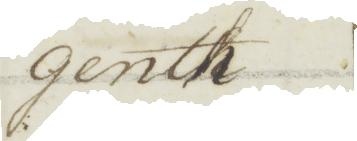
genth
